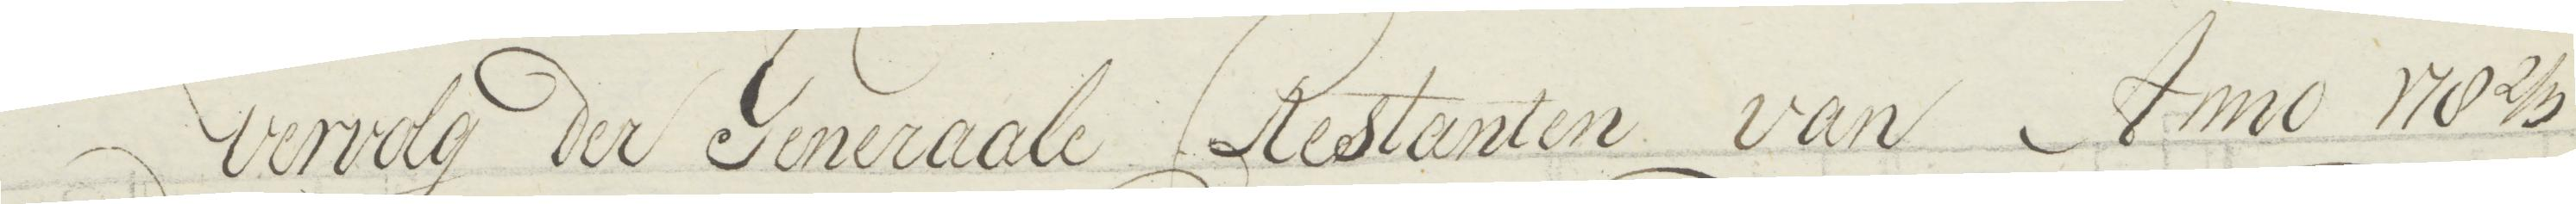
vervolg der Generaale Restanten van Anno 1782/3
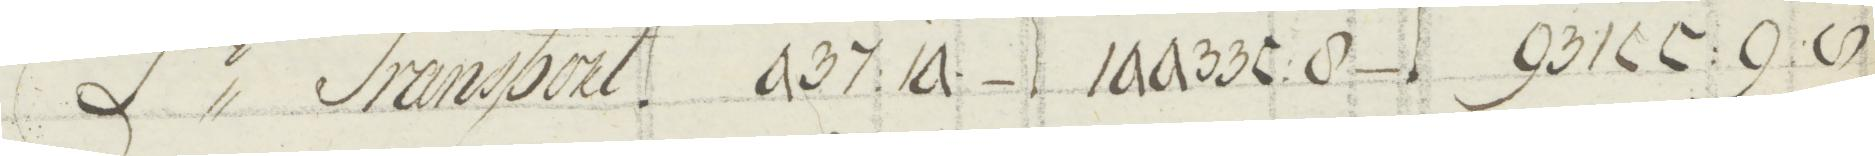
P„r Transportƒ 437:14: — ƒ 144335:8— ƒ 93155:9:8
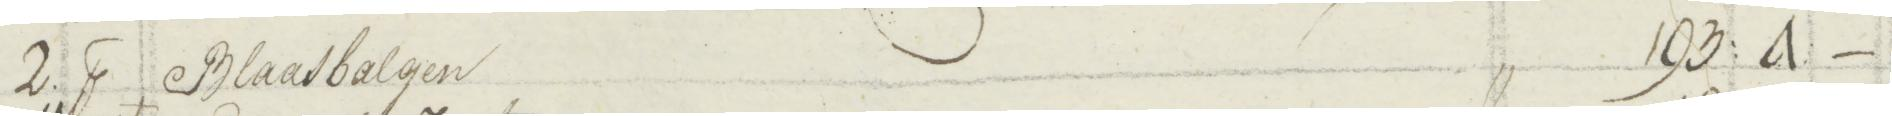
2. p Blaasbalgen „ 193: 4: —
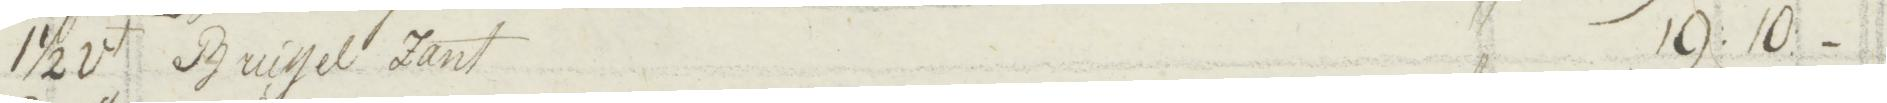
1½ vt Brugel zant „ 19:10:—
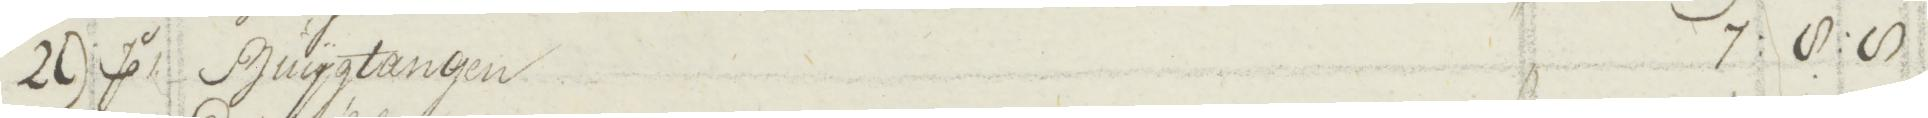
29 p„s Buijgtangen „ 7:8:8
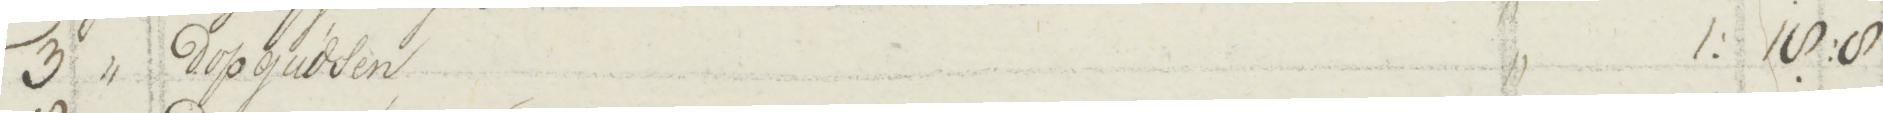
3 „ dop gudsen „ 1:18:8
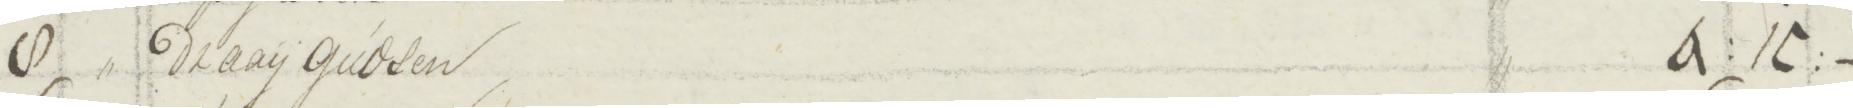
8 „ draaij gudsen „ 4:15:—
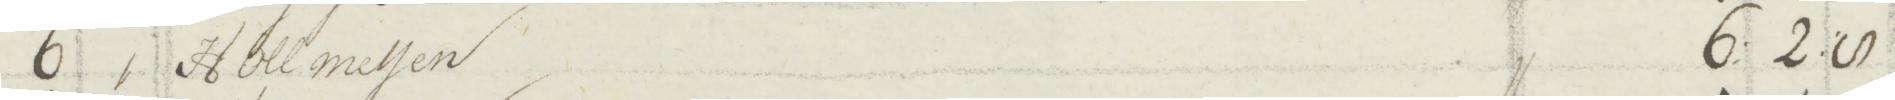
6 „ Hollmeyen „ 6:2:8
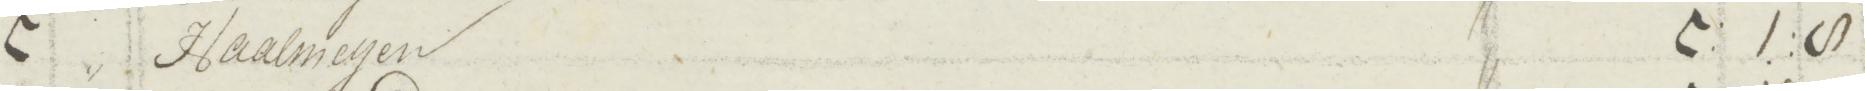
5 „ Haalmeyen „ 5:1:8
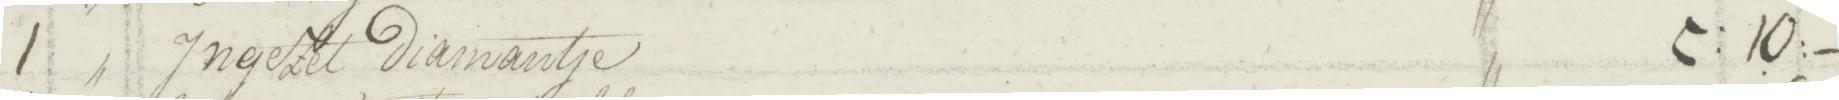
1 „ Jngezet diamantje „ 5:10:—
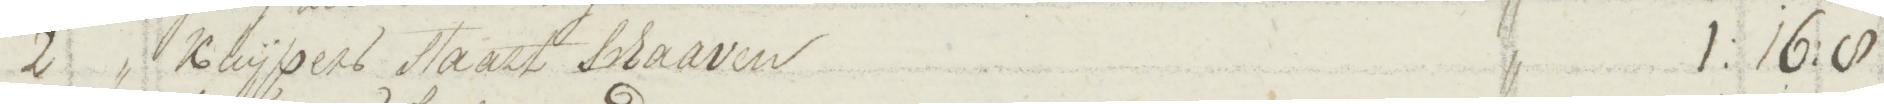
2 „ Kuijpers staart schaaven „ 1:16:8
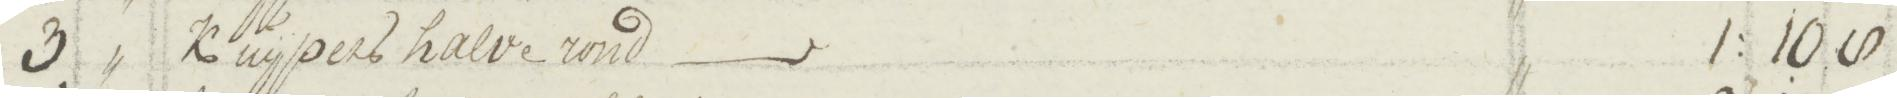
3 „ Kuijpers halve rond _o „ 1:10:8
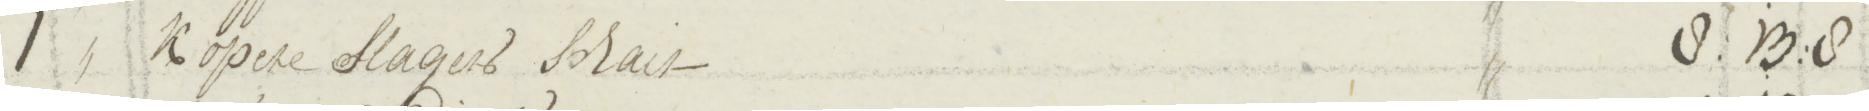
1 „ Kopere slagers schait „ 8:13:8
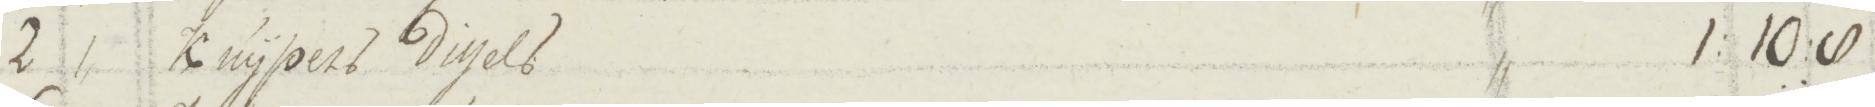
2 „ Kuijpers dissels „ 1:10:8
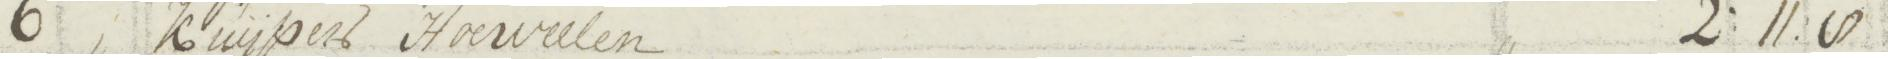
6 „ Kuijpers Hoeweelen „ 2:11:8
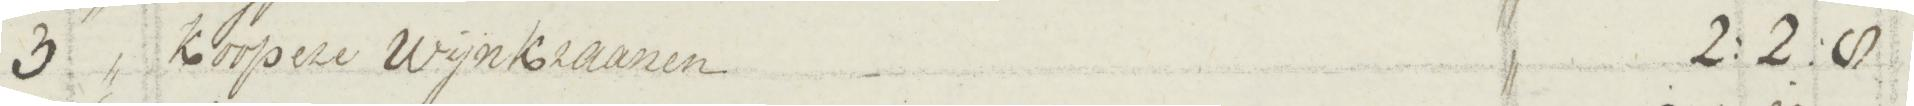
3: „ Koopere wijnkraanen „ 2:2:8
